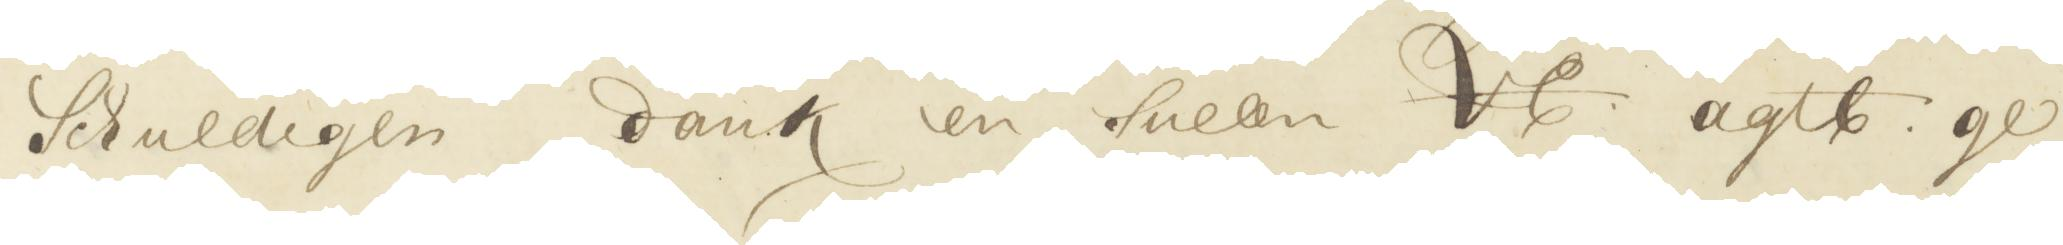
schuldigen dank en sullen VE: agtb: ge
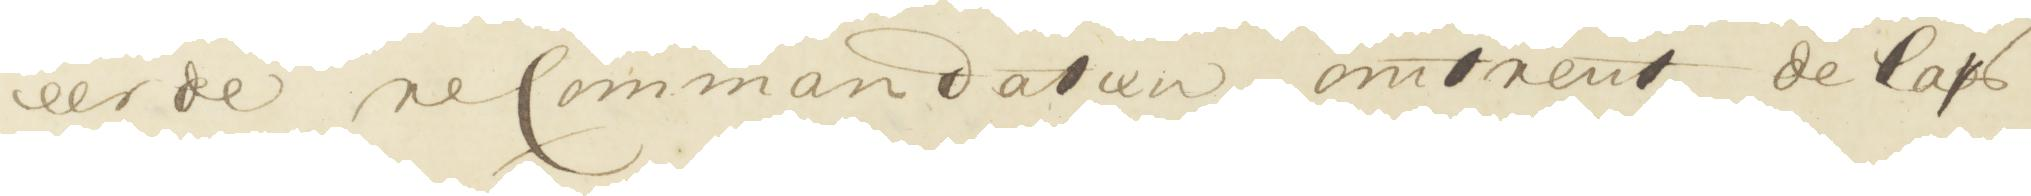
eerde recommandatien omtrent de lass
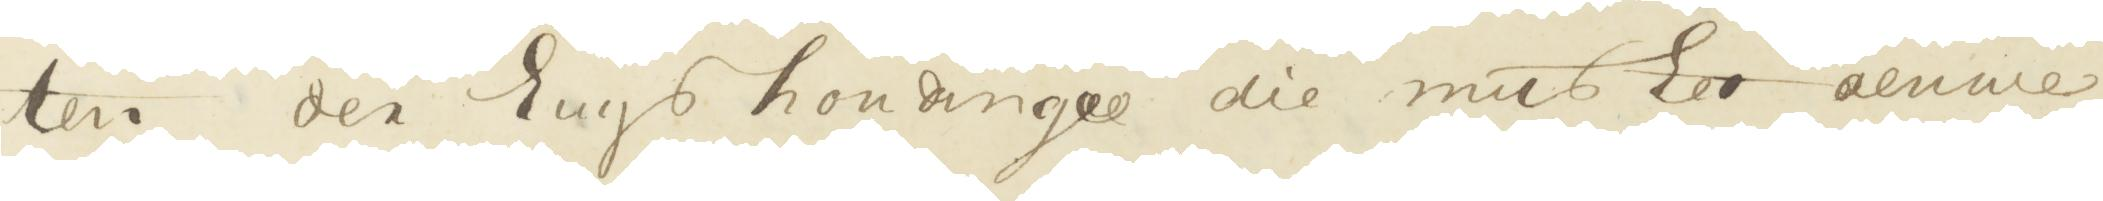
ten der huyshoudinge die mits het aenwe
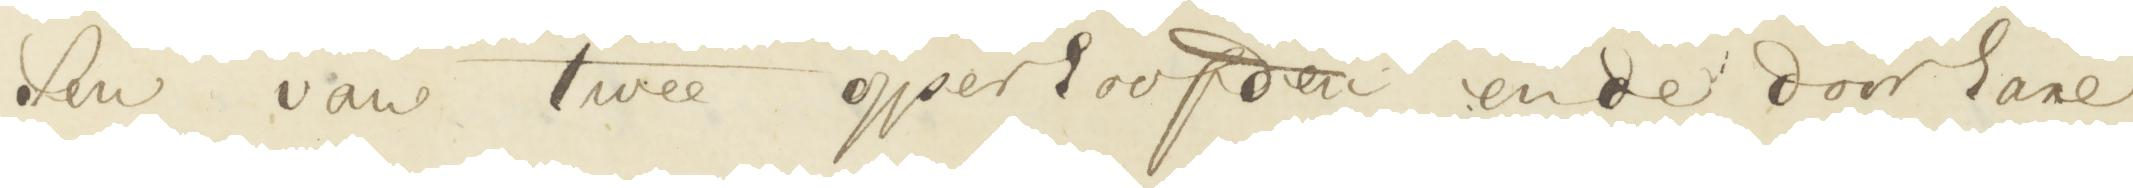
Sen van twee opperhoofden ende door hare
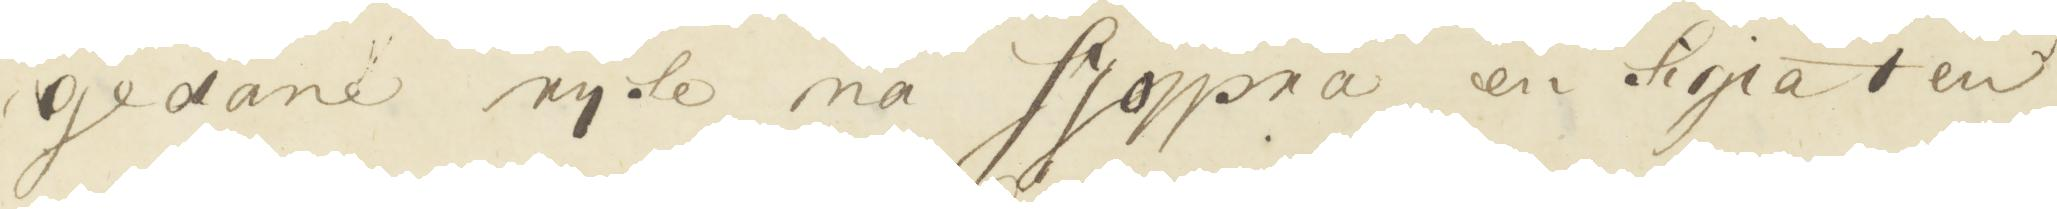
gedane rijse na Sjoppra en Sigia ten
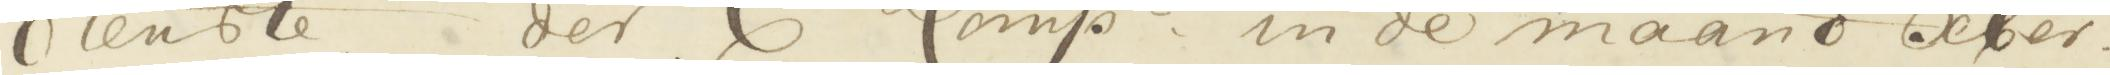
dienste der E Comp:e in de maand xber:
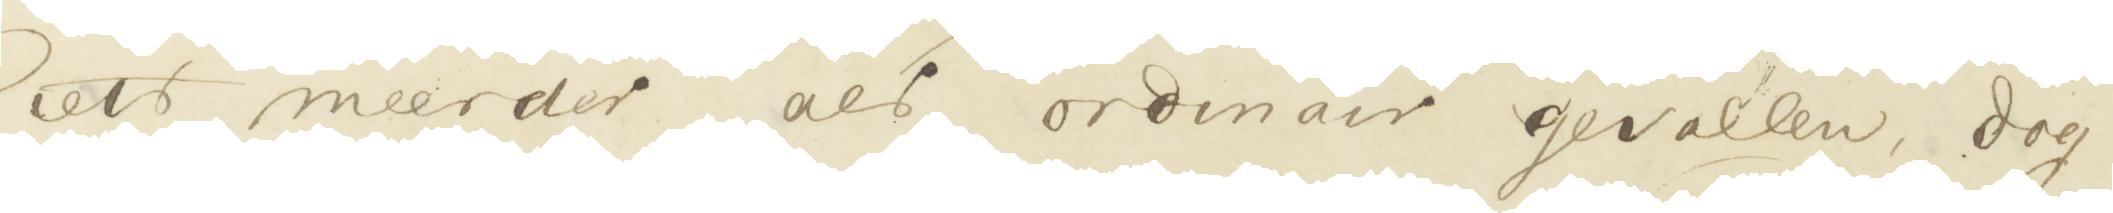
iets meerder als ordinair gevallen, dog
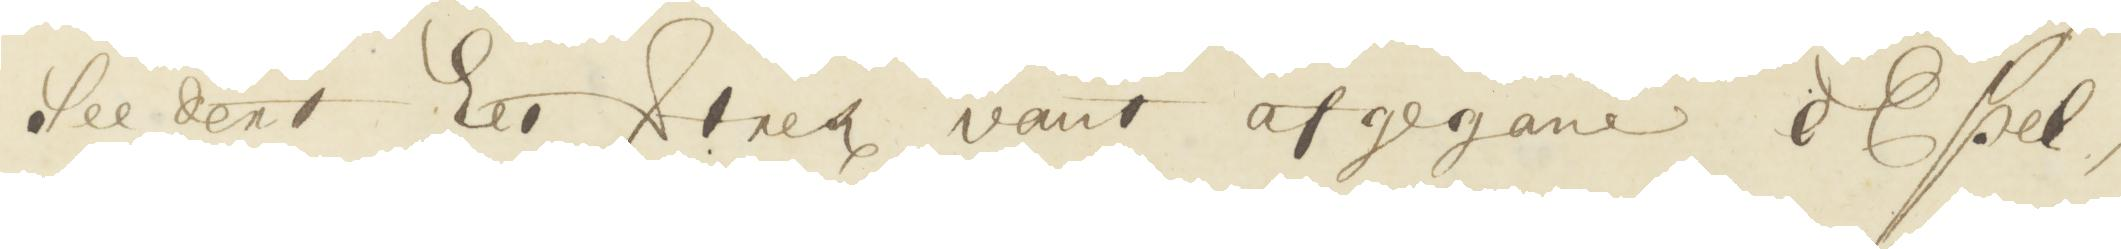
Seedert het vertrek van t afgegane dE pel„
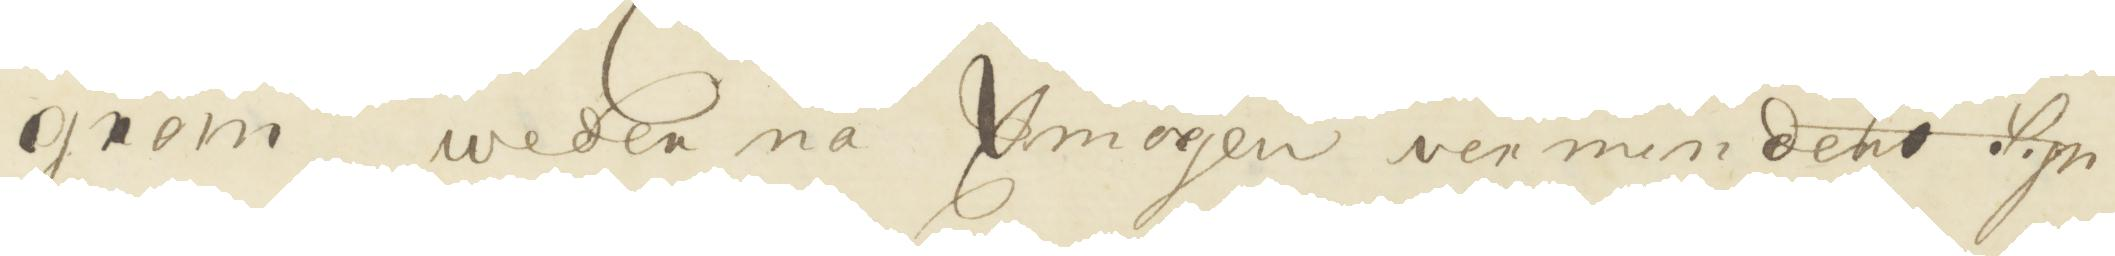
grom weder na vermogen vermindert Syn
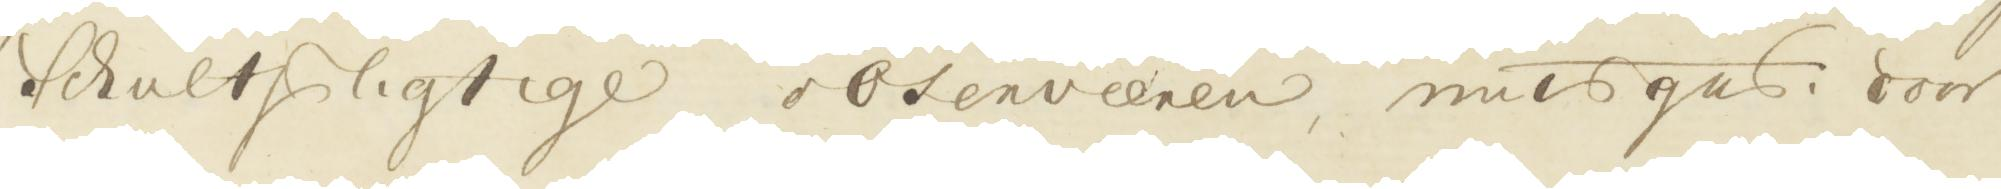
schultpligtige observeeren, mitsgrs: door
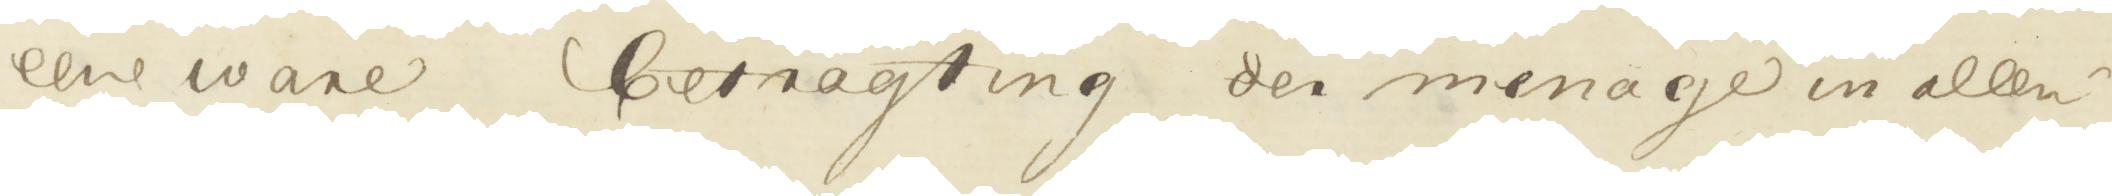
een ware betragting der menage in allen
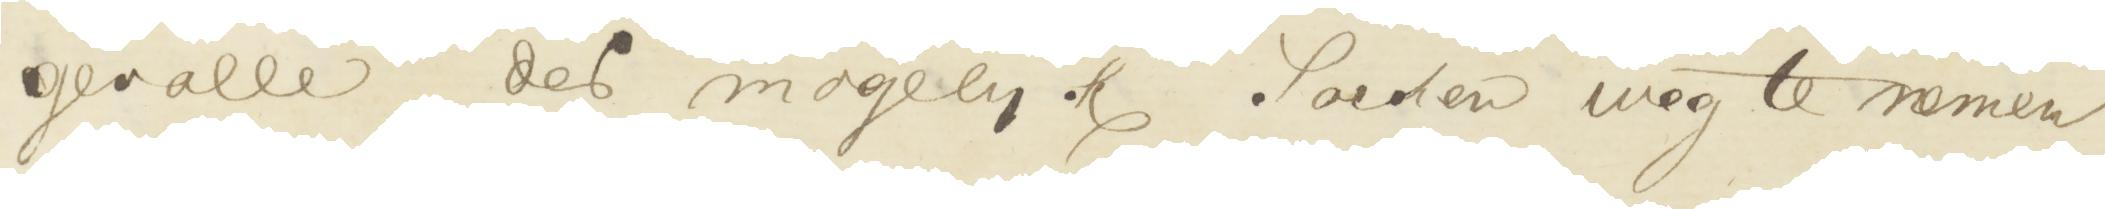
gevalle des mogelyk Soeken weg te nemen
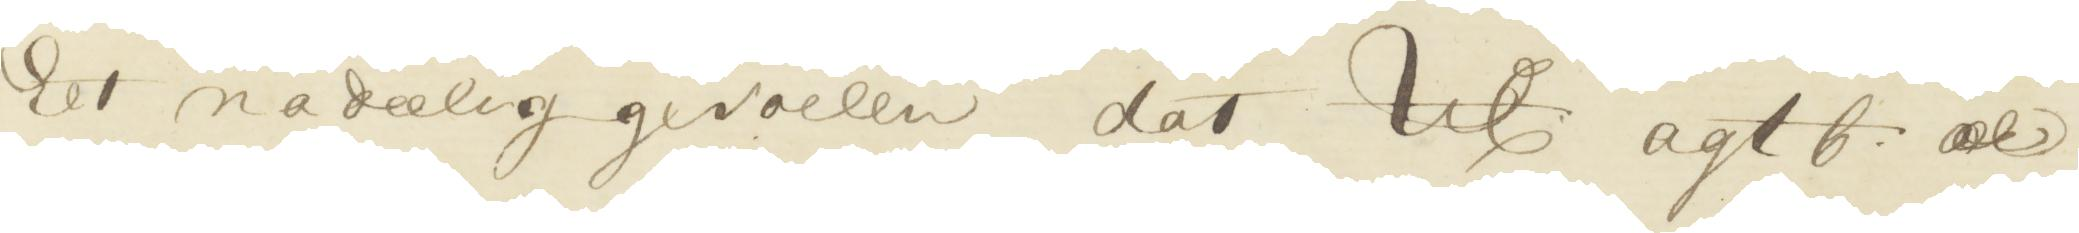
het nadeelig gevoelen dat UE agtb: al
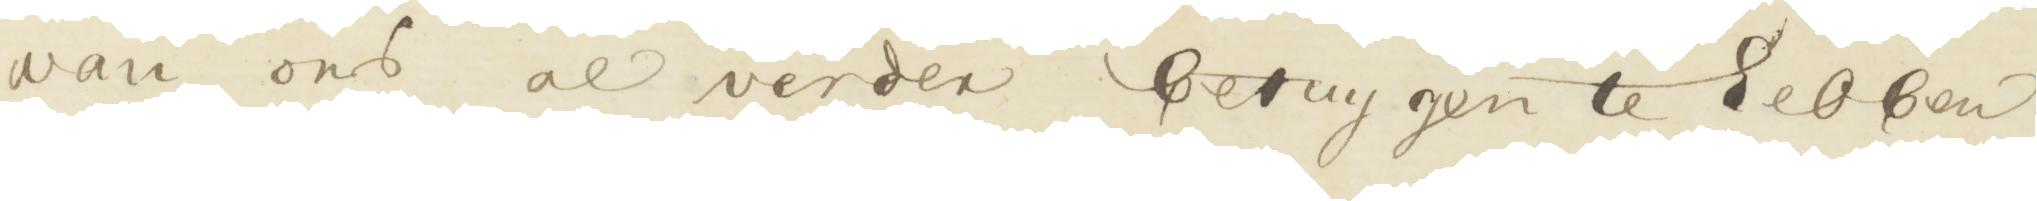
van ons al verder betuygen te hebben
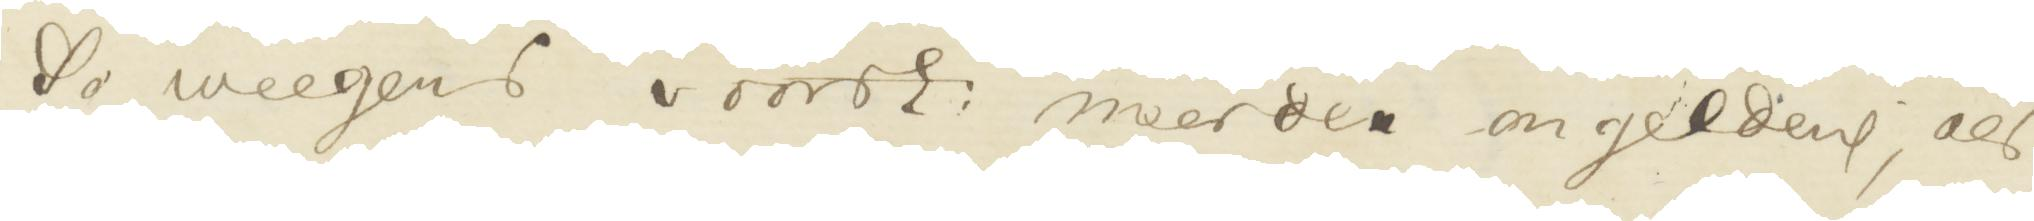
So weegens voorsz: meerder ongeldens, als
